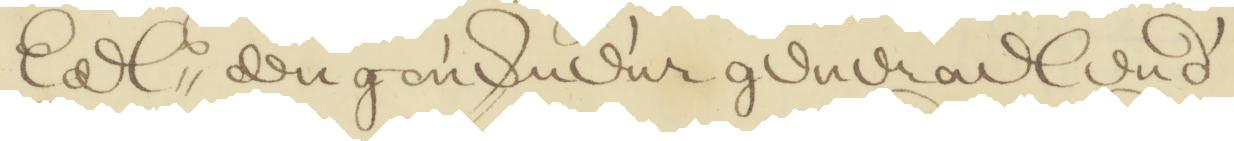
Edel„s den gouverneur generael end'
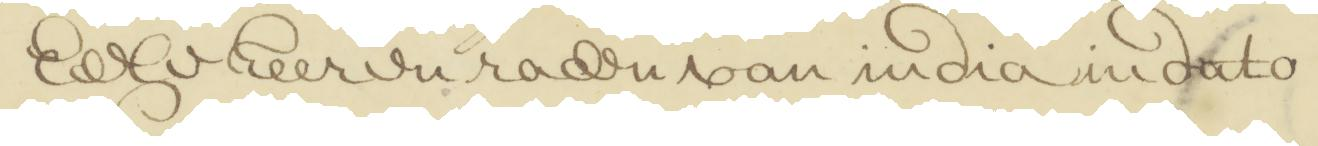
Edele heeren raden van india in dato
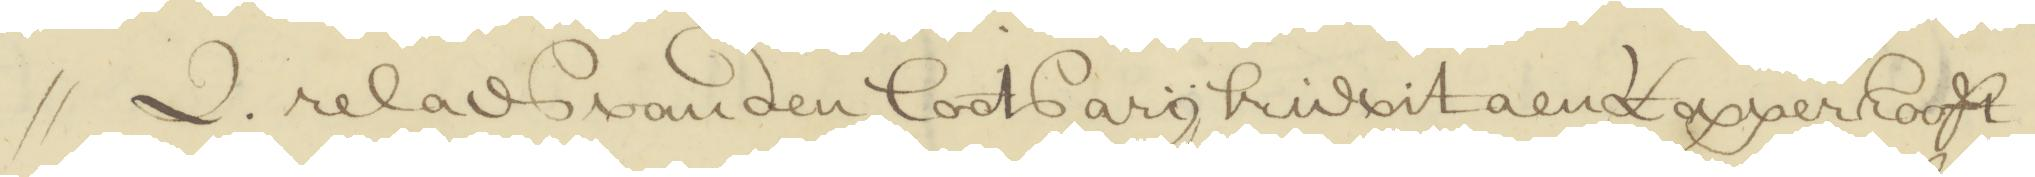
„ 2. relaes van den loots arij kievit aen 't opperhooft
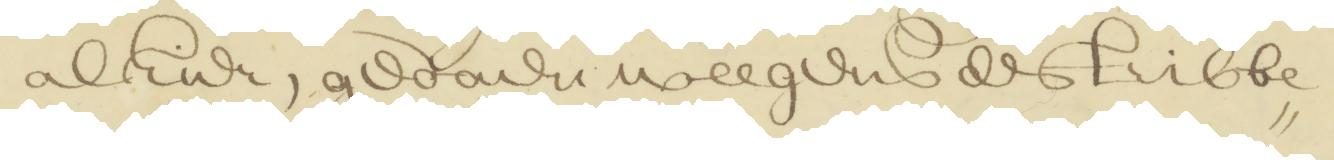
alhier, gedaen weegens destribbe„
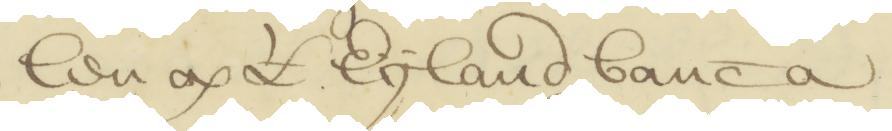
„len op 't Eijland banca
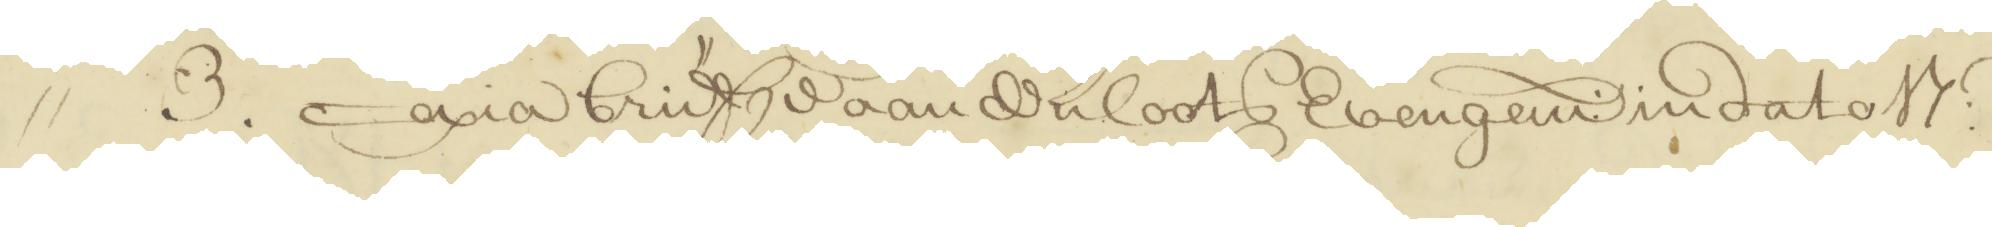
„ 3. copia briefje aan denloots Evengem: in dato 17:'
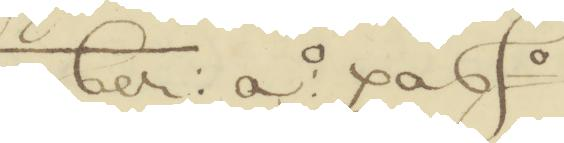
9ber: a:o pass=o
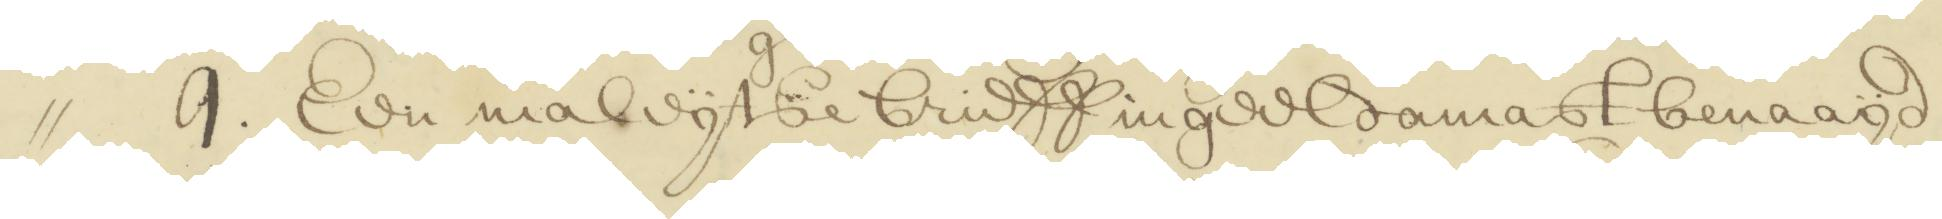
„ 4. Een maleijtse brieff in geel damast benaaijd
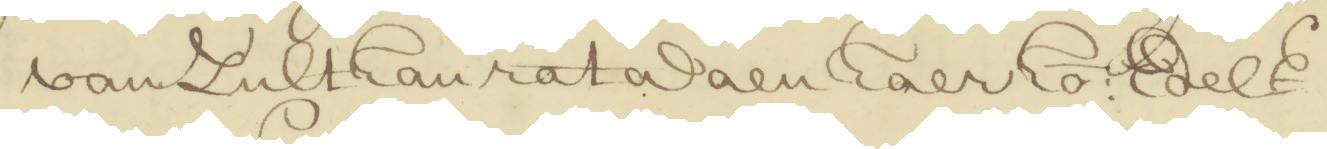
van Zulthan ratoe aen haer ho: Edel=s
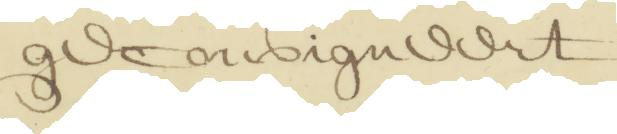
geconsigneert
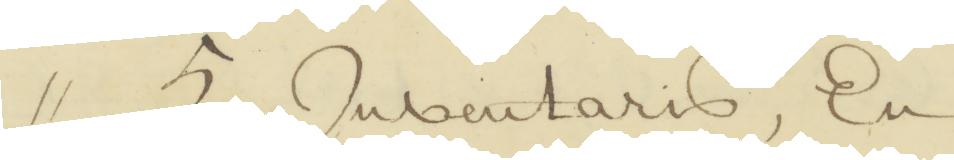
„ 5. Jnventaris, En
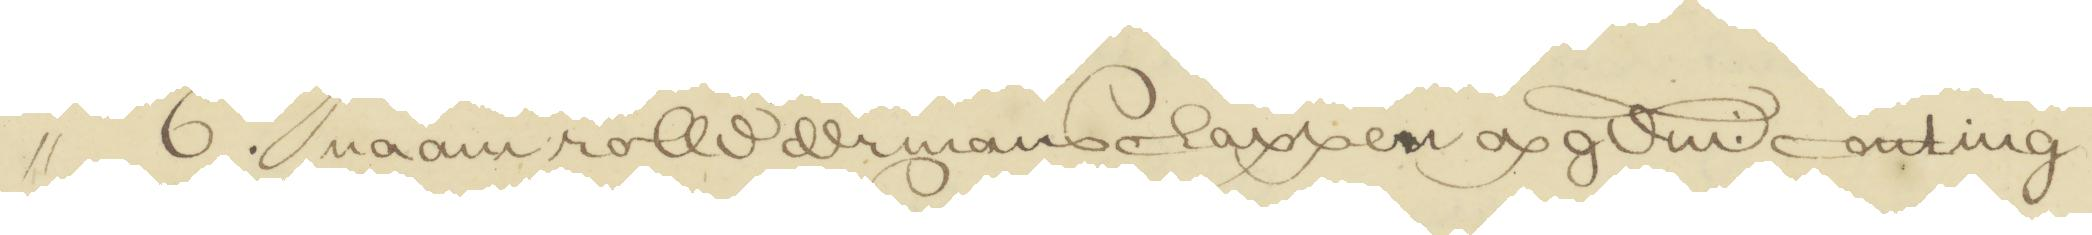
„ 6. naam rolle dermanschappen op gem: conting
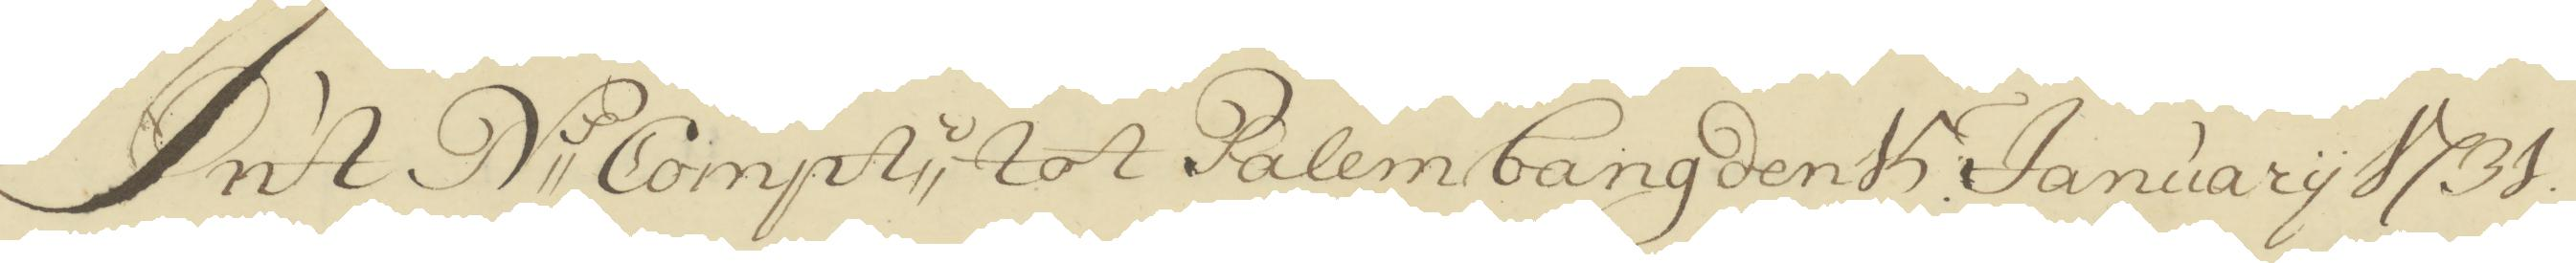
In 't N„s Compt„r tot Palembang den 15:' Ianuarij 1731.
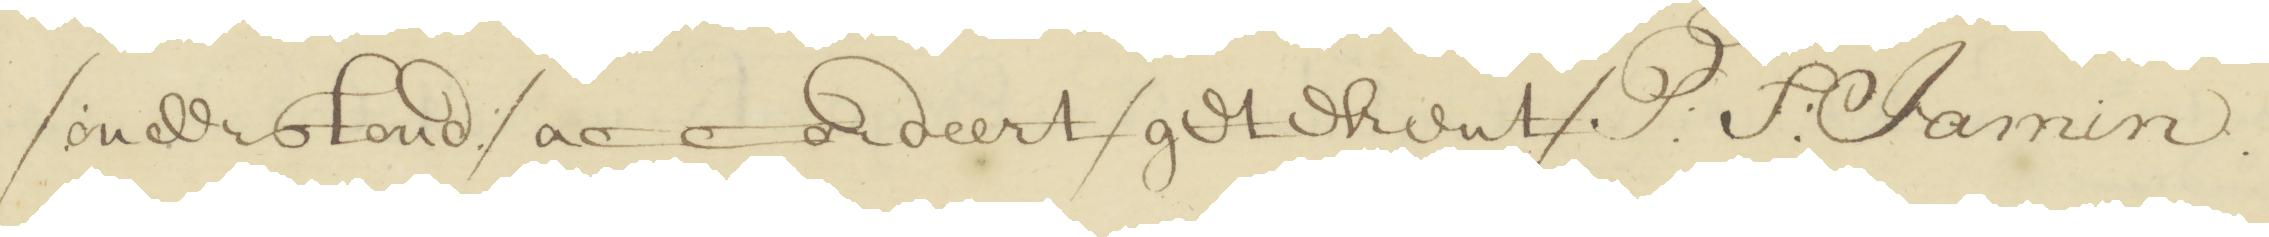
/:onderstond:/ accodeert /getekent/ P: S: Iamin.
